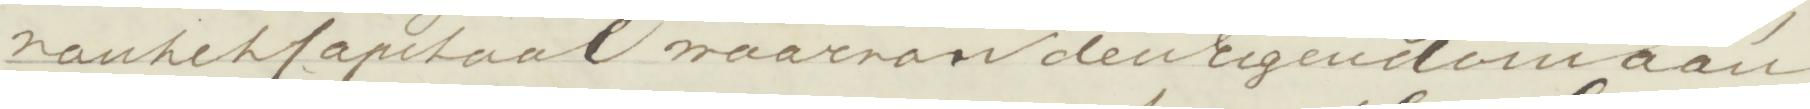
van het Capitaal waarvan den Eigendom aan
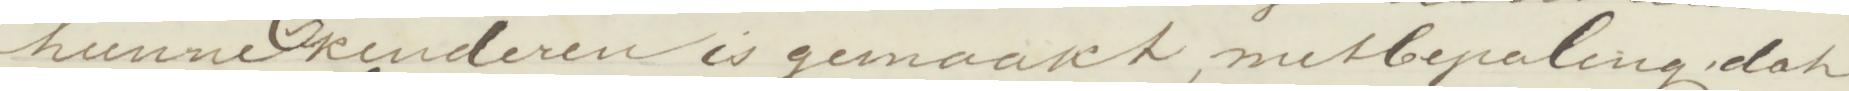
hunne kinderen is gemaakt, met bepaling, dat
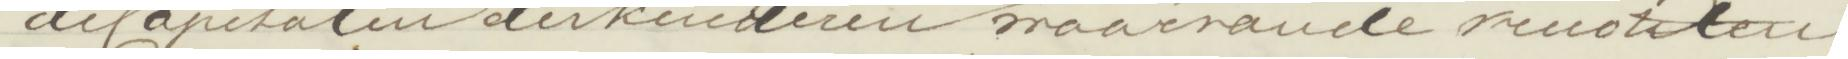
de Capitalen der kinderen waarvan de vruchten
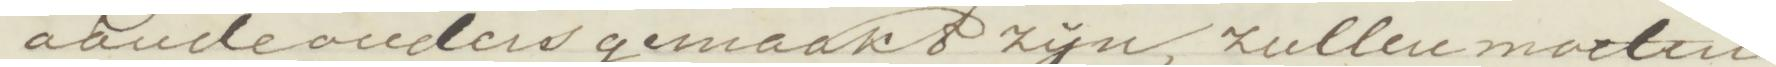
aan de ouders gemaakt zijn, zullen moeten
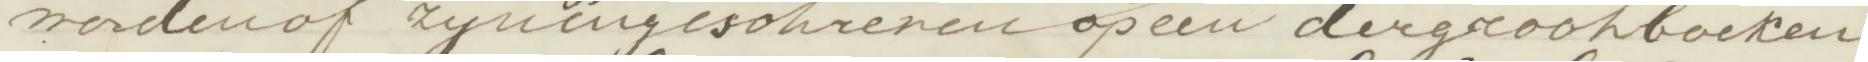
worden of zyn ingeschreven op een der grootboeken
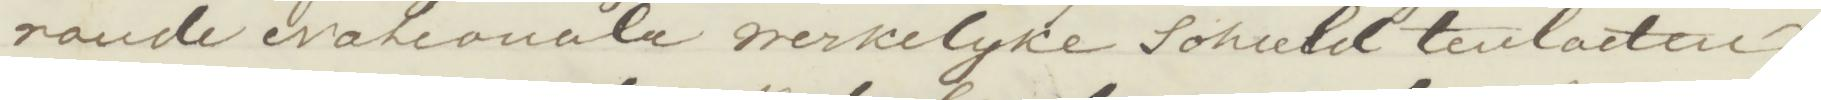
van de Nationale werkelyke schuld ten lasten
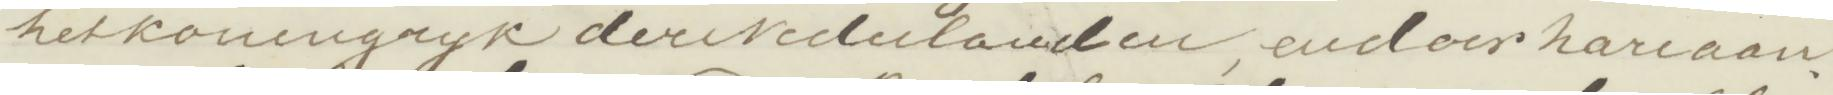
het koningryk der Nederlanden, en door hare aan,
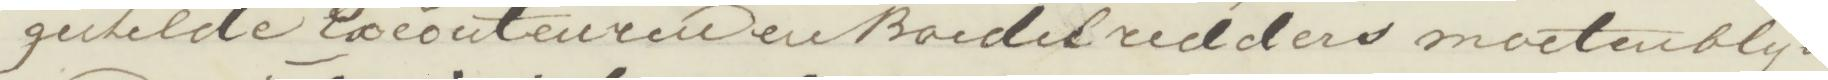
=gestelde Executeuren en Boedel redders moeten bly=
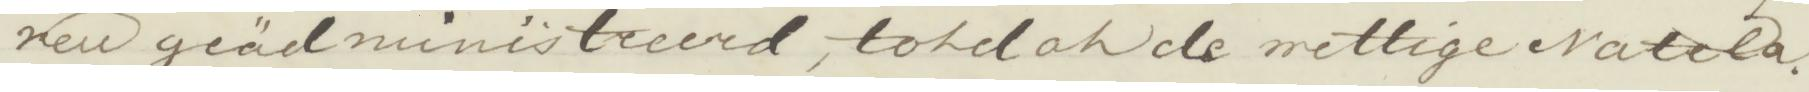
=ven geädministreerd, totdat de wettige Natela.
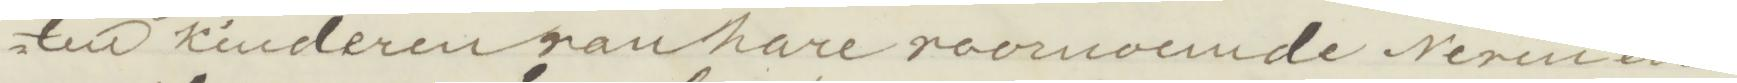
=ten kinderen van hare voornoemde Neven en
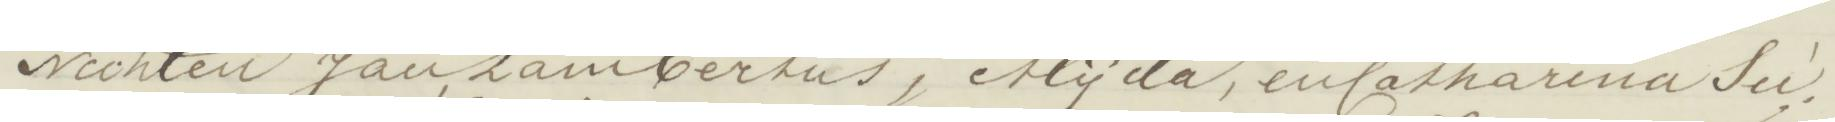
Nichten Jan, Lambertus, Alijda, en Catharina Su,
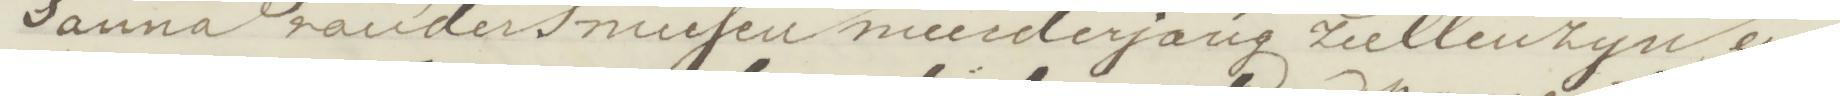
sanna van der Smissen meerderjarig zullen zyn, en
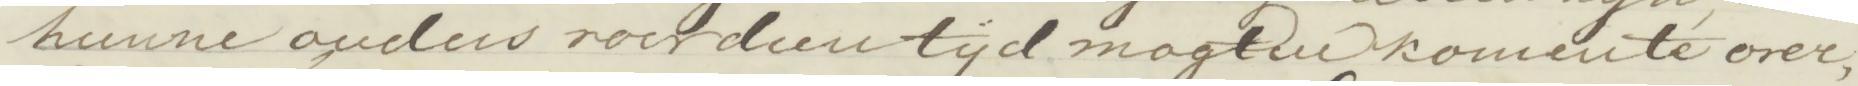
hunne ouders voor dien tijd mogten komen te over,
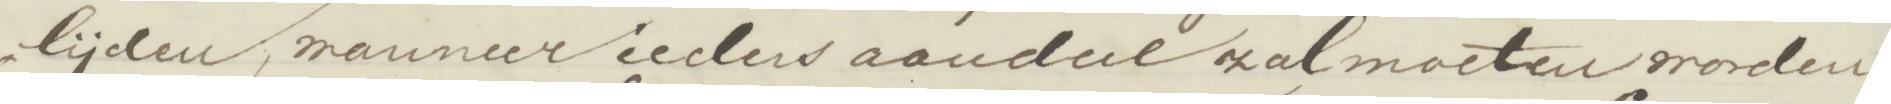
=lijden, wanneer ieders aandeel zal moeten worden
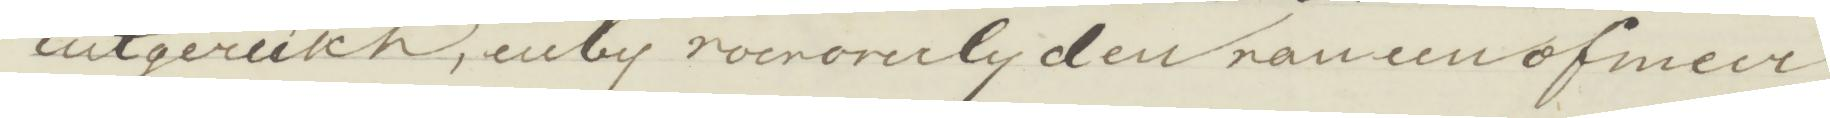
uitgereikt, en by vooroverlyden van een of meer
